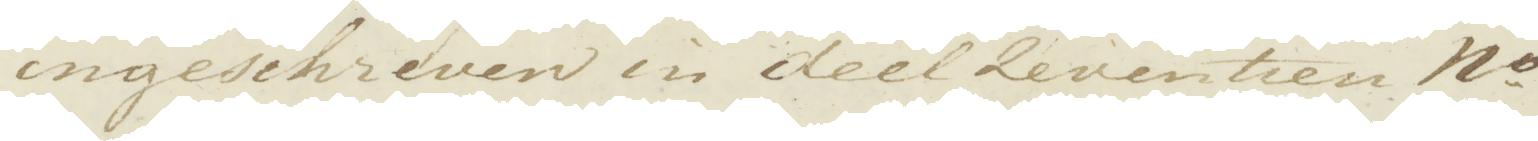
ingeschreven in deel zeventien N„o
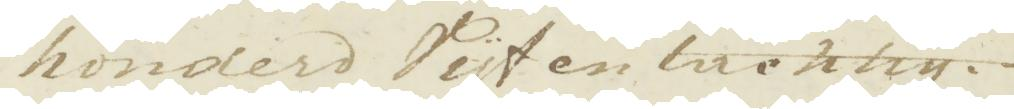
honderd Vijf en tachtig.
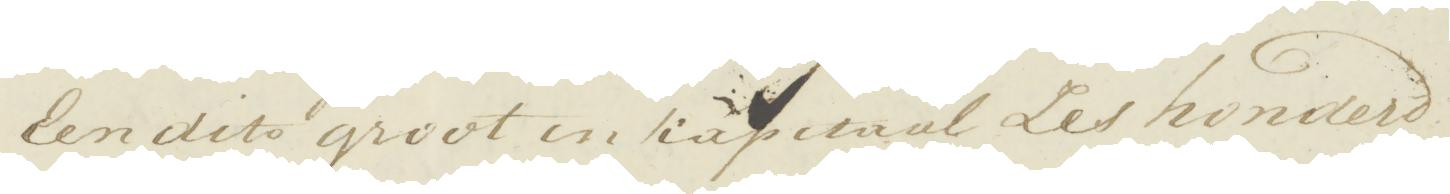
Een dito groot in kapitaal Zes honderd
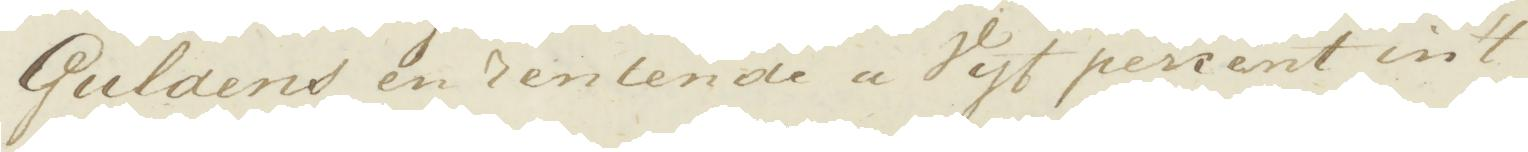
Guldens en rentende a Vyf percent in ’t
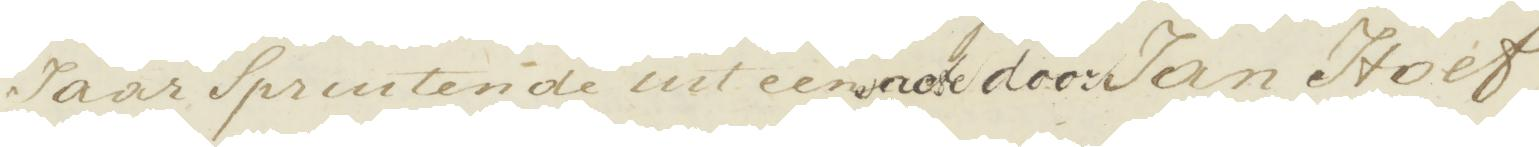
Jaar spruitende uit een acte door Jan Hoef
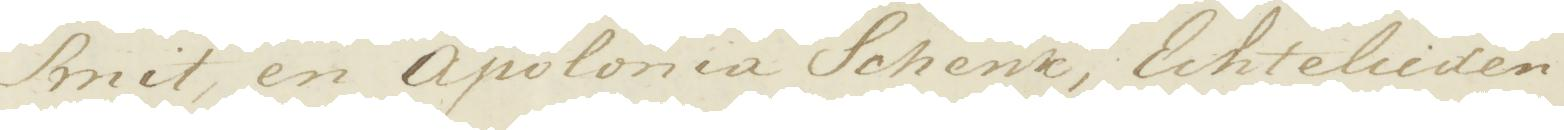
Smit, en Apolonia Schenk, Echtelieden
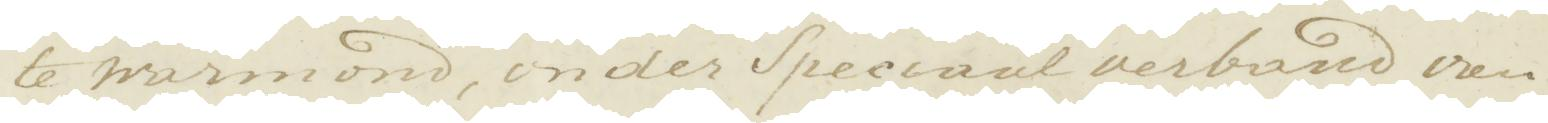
te warmond, in der speciaal verband van
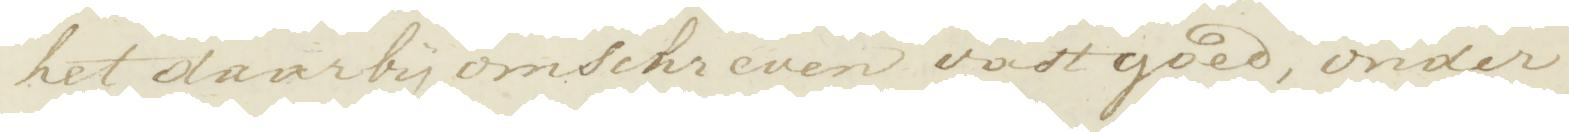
het daarbij omschreven vastgoed, onder
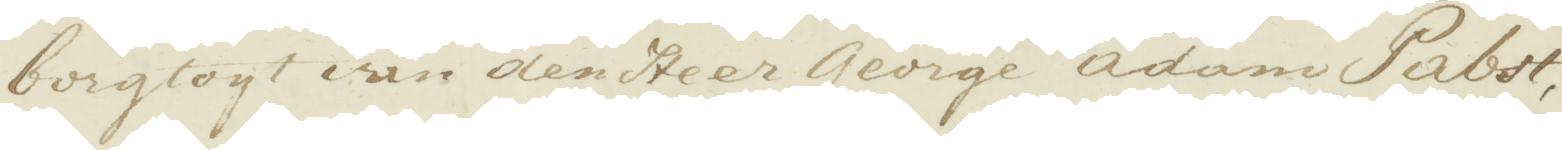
borgtogt van den Heer George adam Pabst,
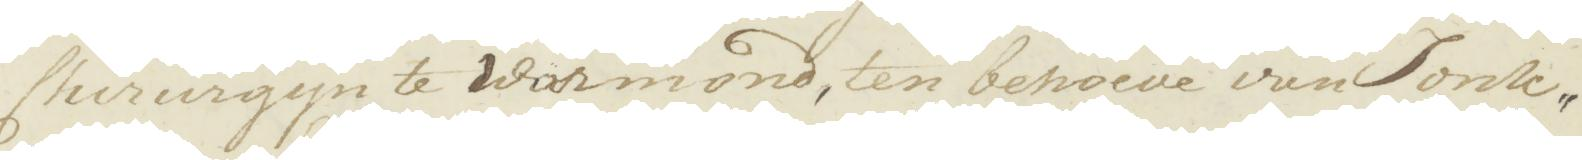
Chirurgijn te warmond, ten behoeve van Jonk„
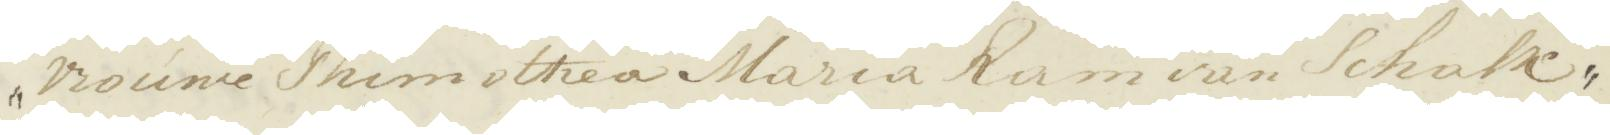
„vrouwe Thimothea Maria Ram van Schalk„
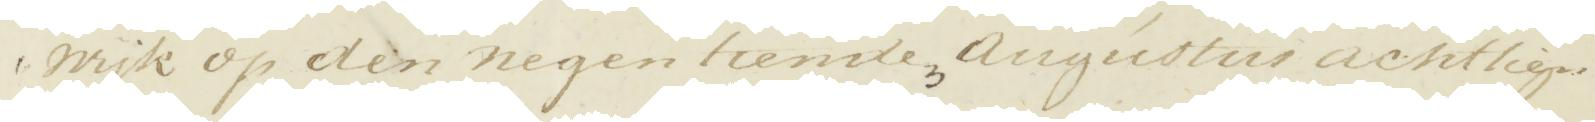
„wijk op den negentiende Augustus achttien
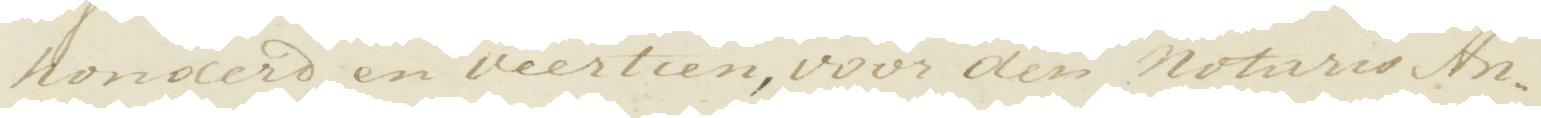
honderd en veertien, voor den notaris An„
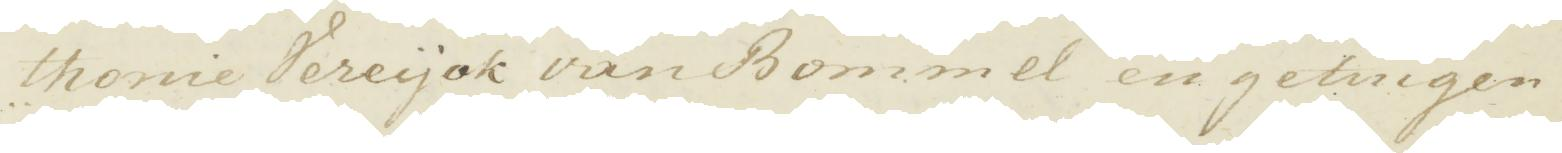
„thonie Vereijck van Bommel en getuigen
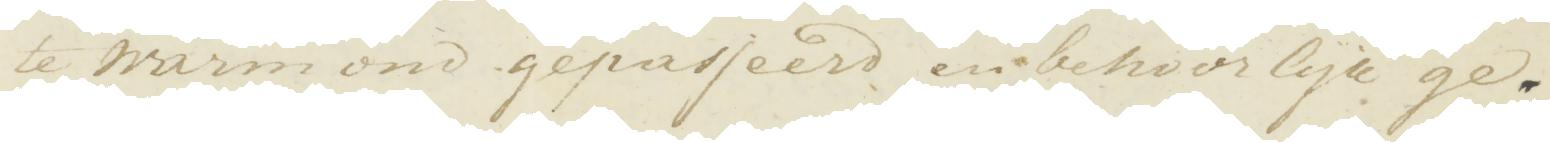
te warmond gepasseerd en behoorlijk ge„
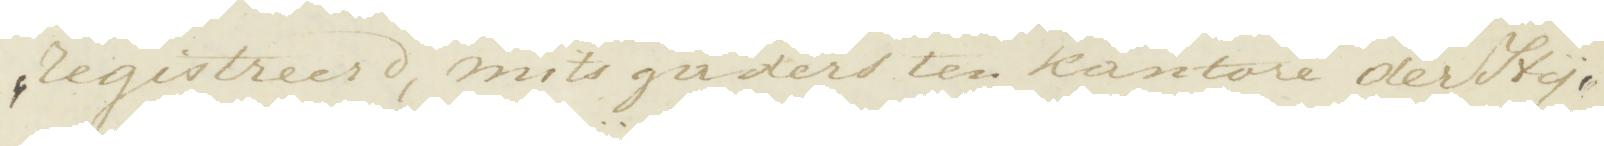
„registreerd, mits gaders ten kantore der Hij„
